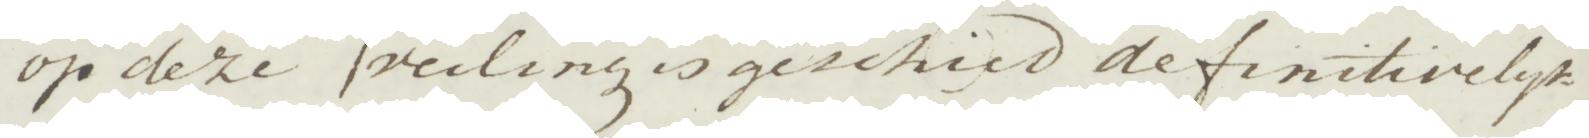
op deze veiling is geschied definitivelyk
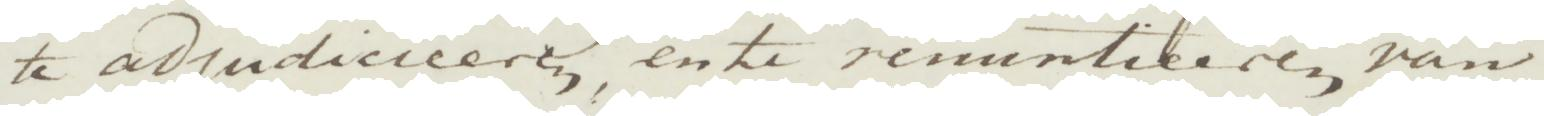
te adjudicieeren, en te renuntieeren van
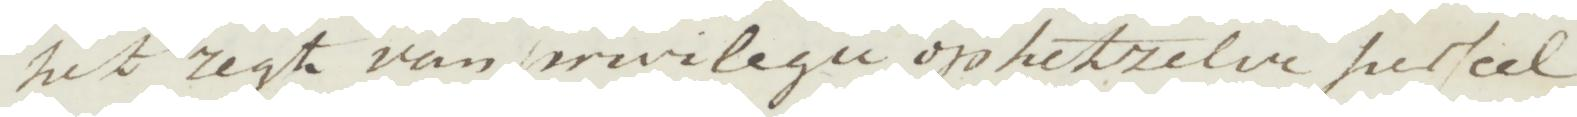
het regte van privilegie op hetzelve perceel
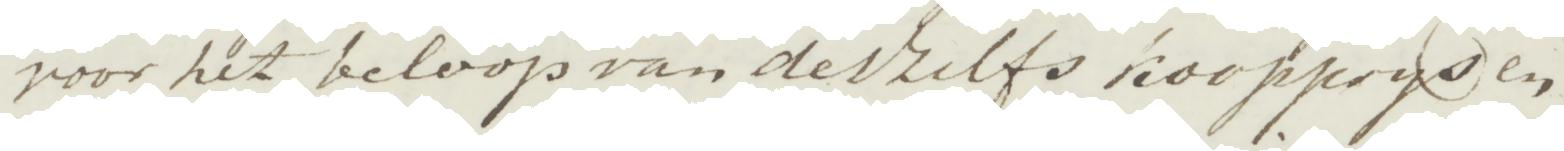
voor het beloop van deszelfs koopprys, en
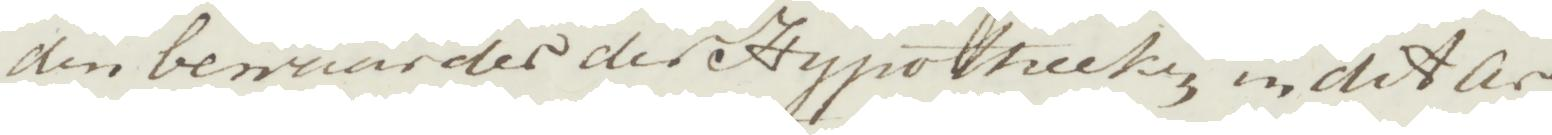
den bewaarder der Hypotheeken in dit ar=
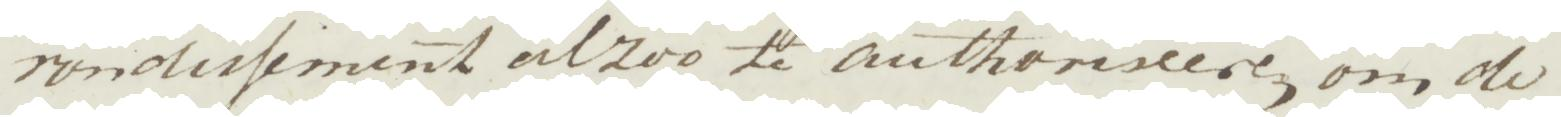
=rondissement alzoo te authoriseeren om de
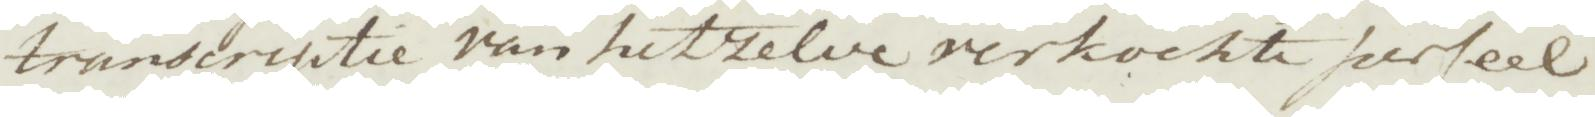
transcriptie van hetzelve verkochte perceel
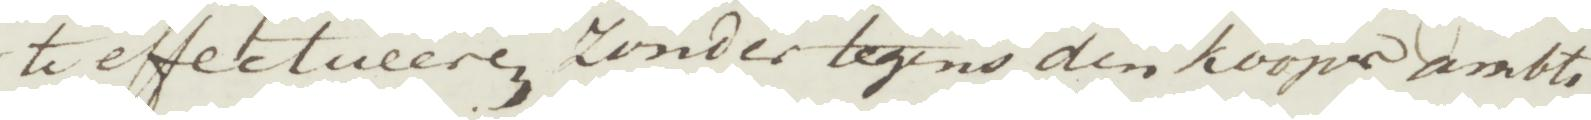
te effectueeren zonder tegens den kooper ambts=
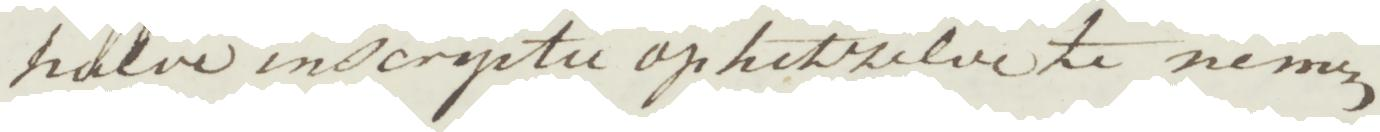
halve inscriptie op hetzelve te nemen
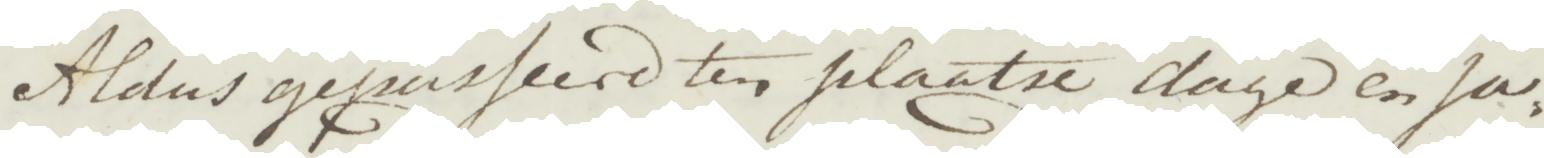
Aldus gepasseerd ten plaatse, dage en Ja„
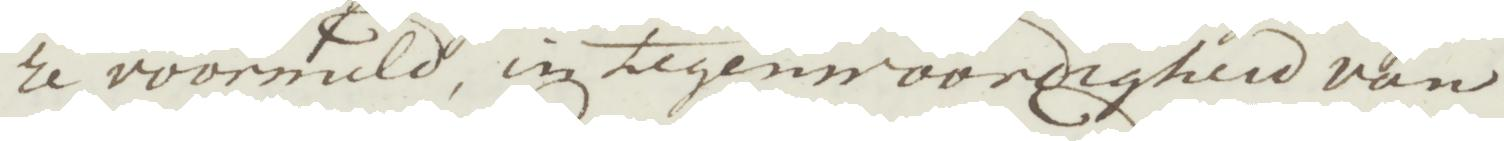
=re voormeld, in tegenwoordigheid van
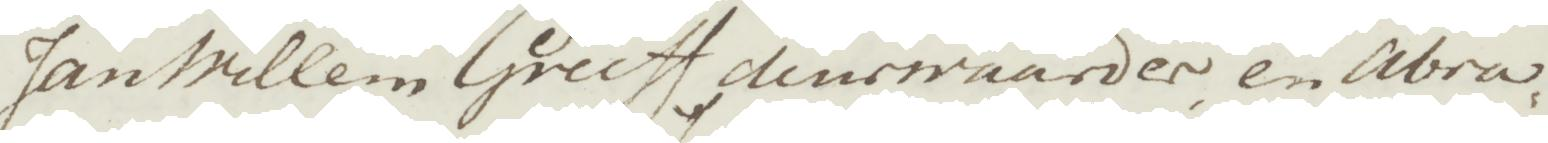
Jan Willem Greeff, deurwaarder, en Abra=
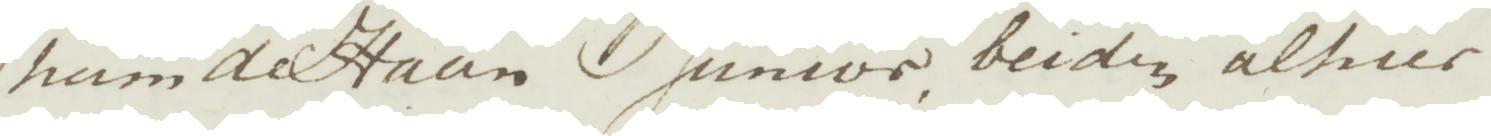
ham de Haan Junior, beiden alhier
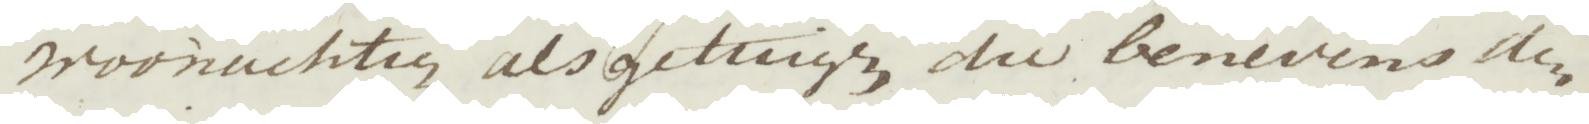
woonachtig als getuigen die benevens den
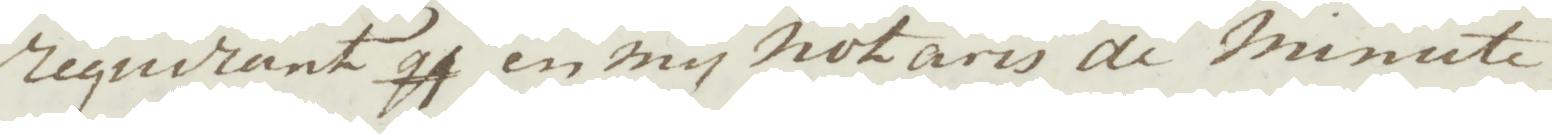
requirant qq en my notaris de minute
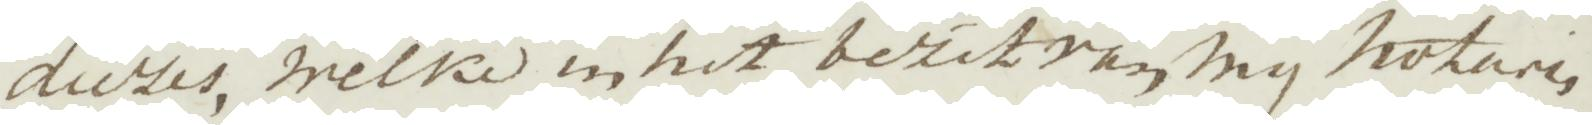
deezes, welke in het bezit van my notaris
